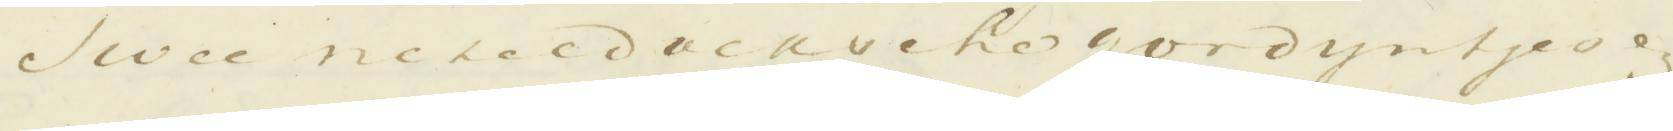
Twee neteldoeksche gordyntjes en
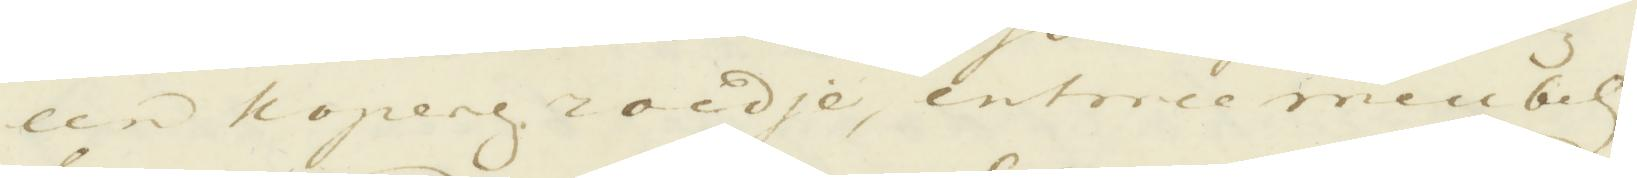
een koperen roedje, En twee meubel
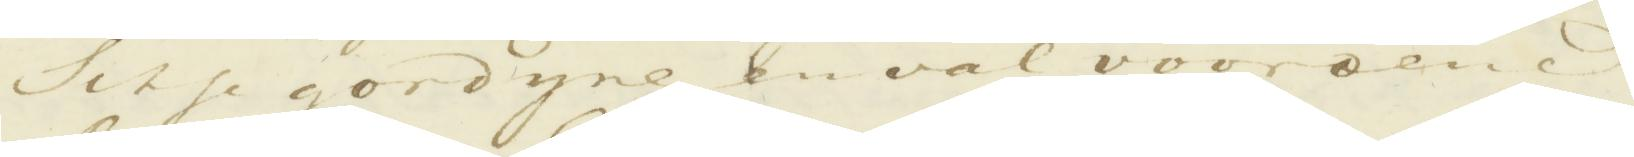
Sitje gordynen en val voor eene
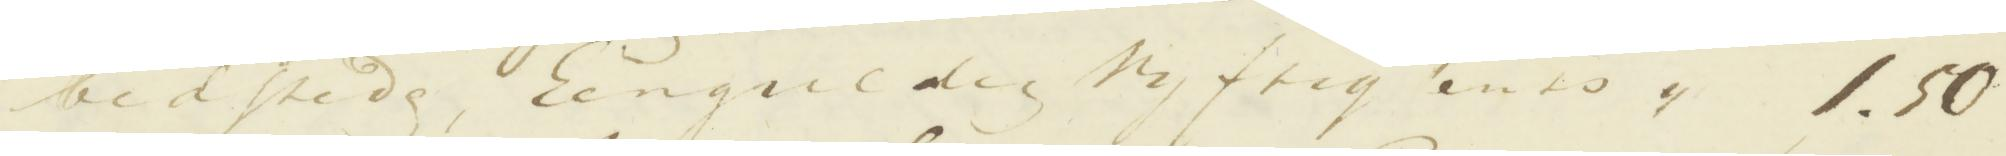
bedsteden, Een gulden Vyftig Cents „ 1.50
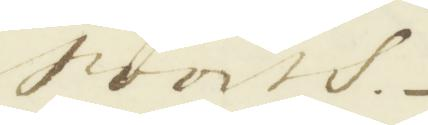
voorts.-
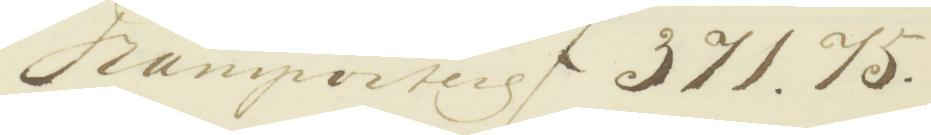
Transporteren ƒ 371.75.
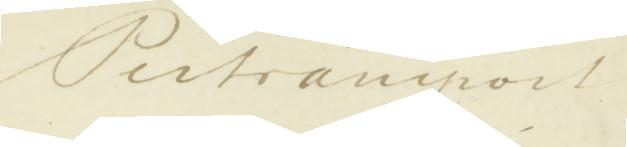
Pertransport.
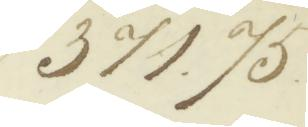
371.75.
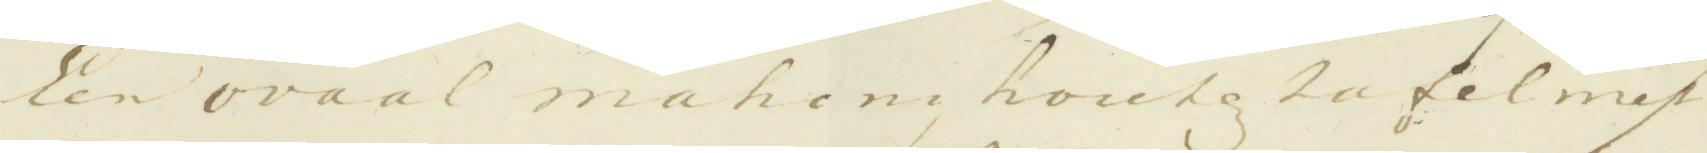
Een ovaal mahonyhouten tafel met
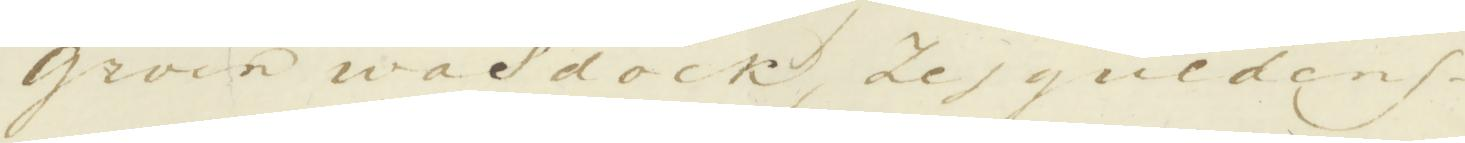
groen wasdoek, zes guldens.
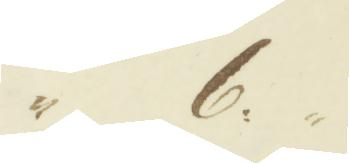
„ 6: „
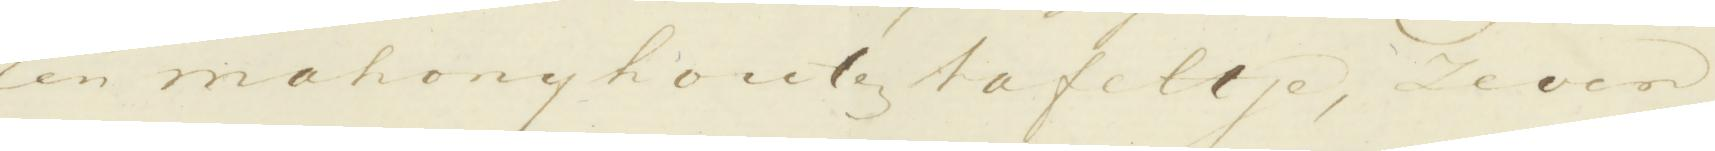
en mahonyhouten tafeltje, zeven
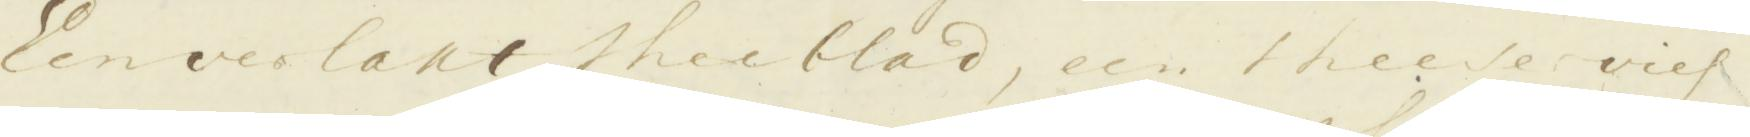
Een verlakt thee blad, een theeservies
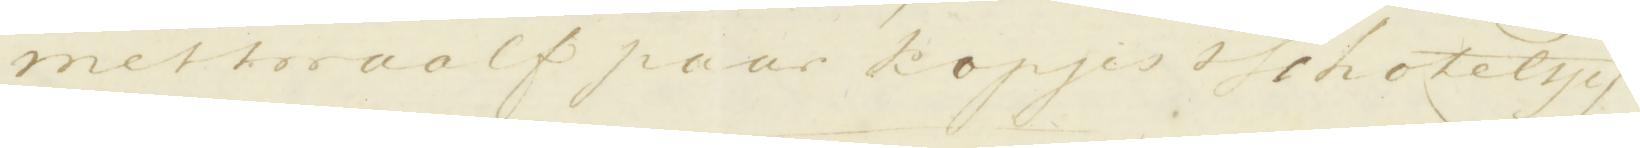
met twaalf paar kopjes en schoteltjes
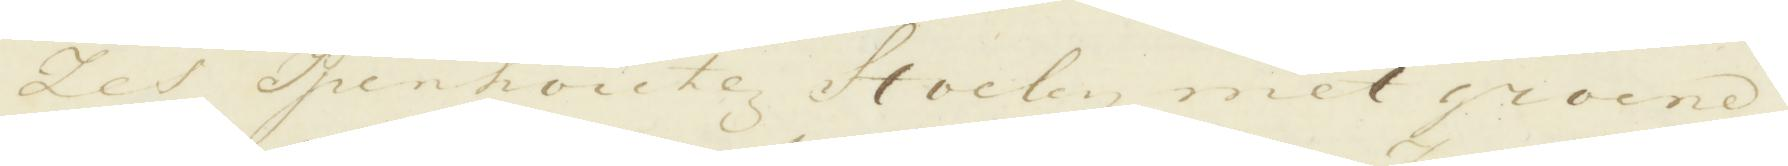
Zes Ipenhouten stoelen met groene
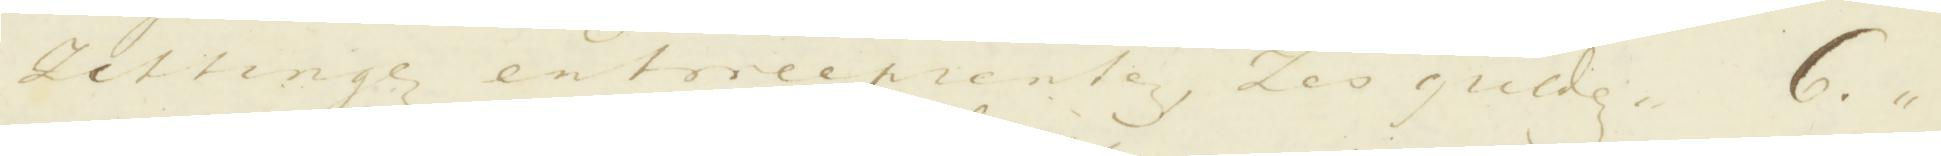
zittingen en twee prenten, Zes gulden 6.„
